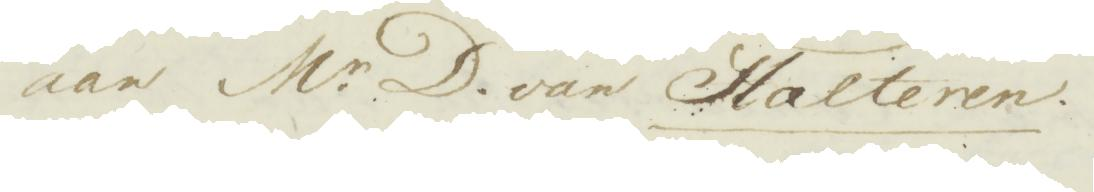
aan M:r D. van Halteren.
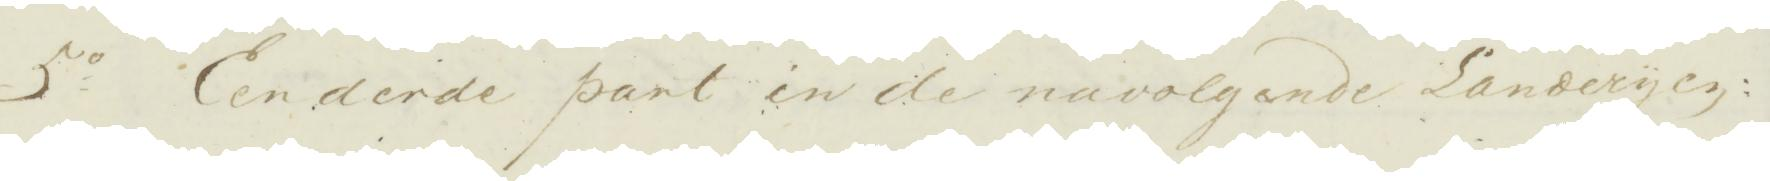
5„o Een derde part in de navolgende Landerijen:
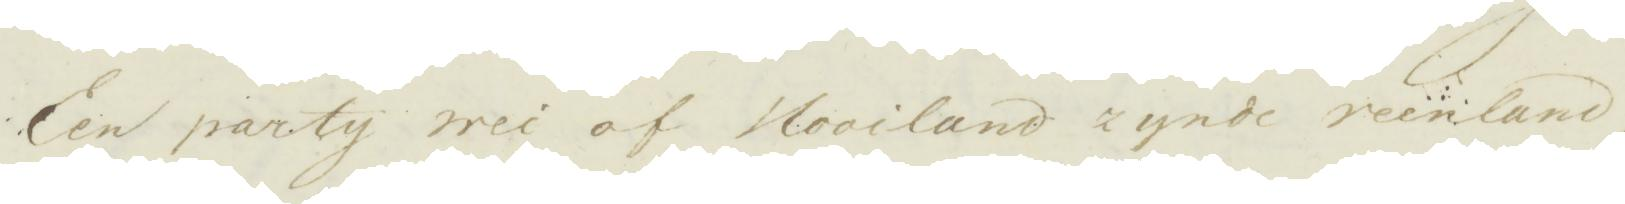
Een partij wei of Hooiland zynde veenland,
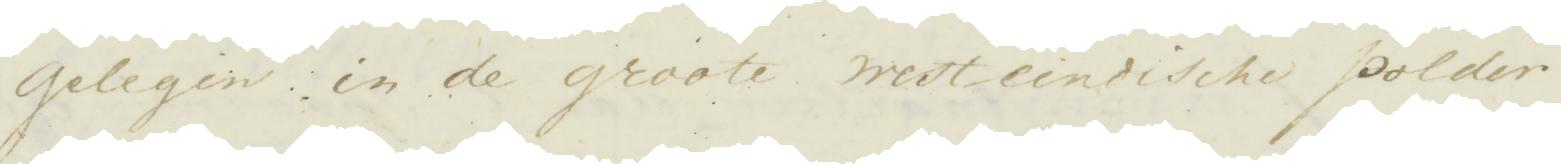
gelegen. in de groote west eindische polder
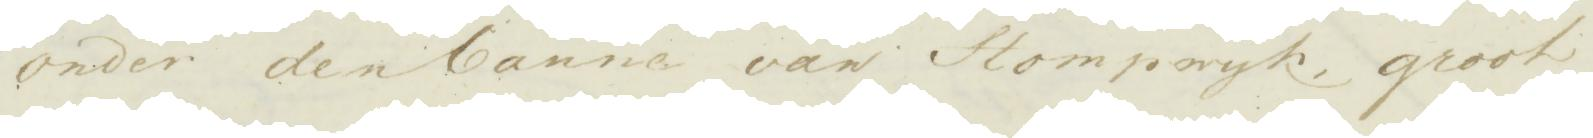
onder den banna van Hompwyk, groot
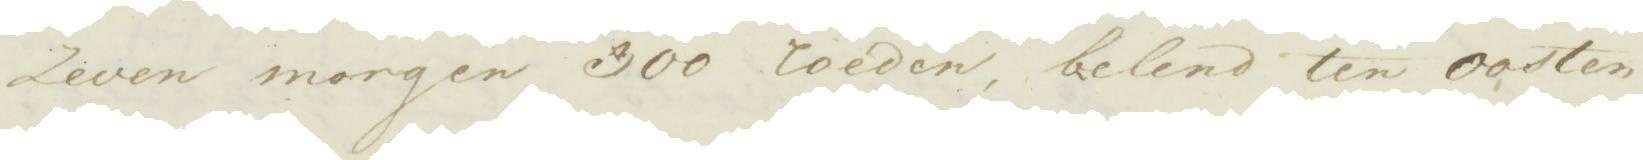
zeven morgen 300 roeden, belend ten oosten
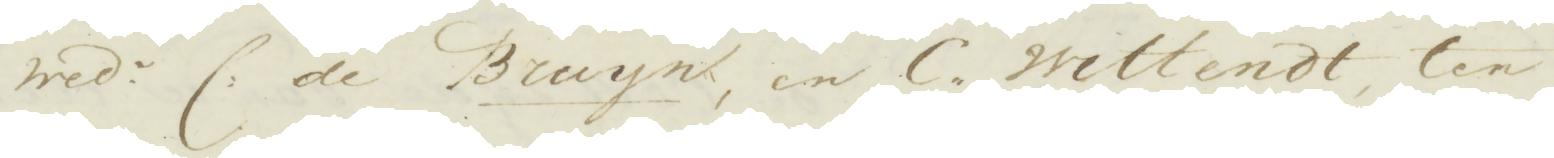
wed: C: de Bruyn, en C. Wittendt, ten
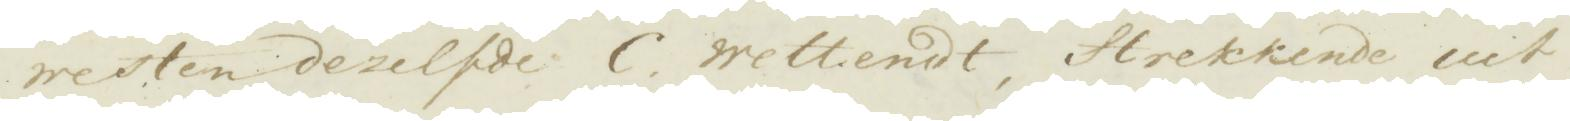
westen dezelfde; C. wettendt, strekkende uit
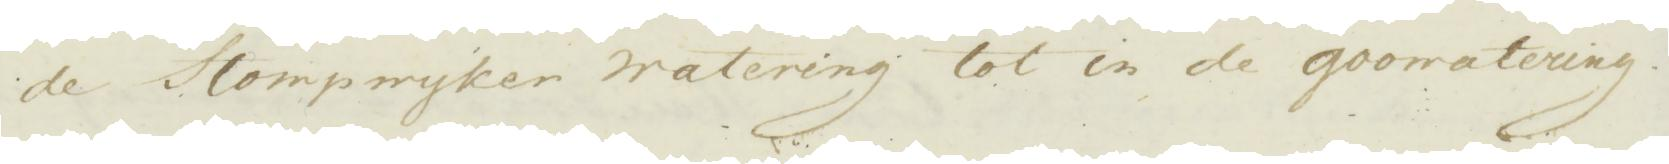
de stompwijker watering tot in de goowatering.
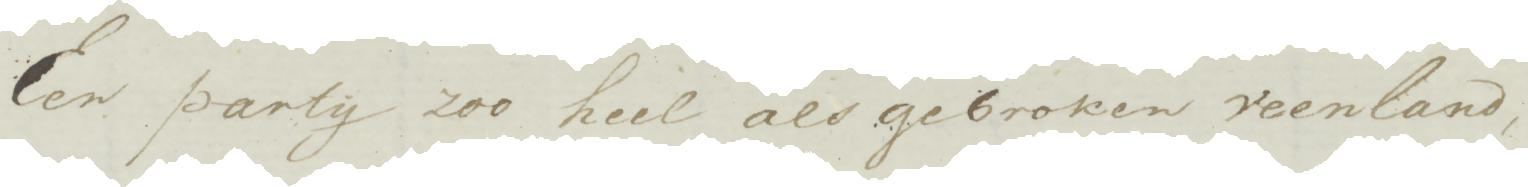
Een partij zoo heel als gebroken veenland,
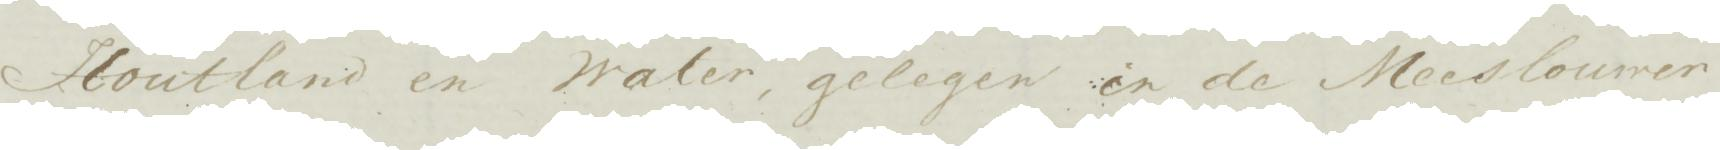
Houtland en water, gelegen in de Meeslouwer
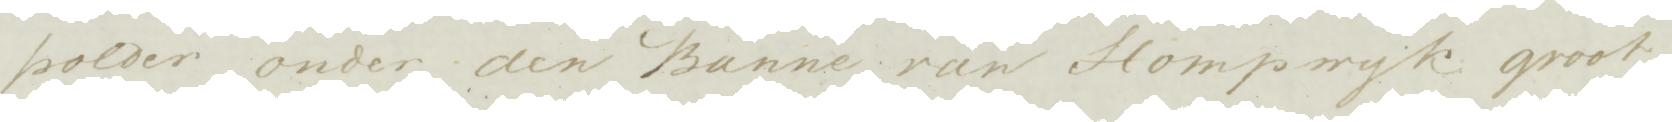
polder onder den Banne van Hompwijk groot
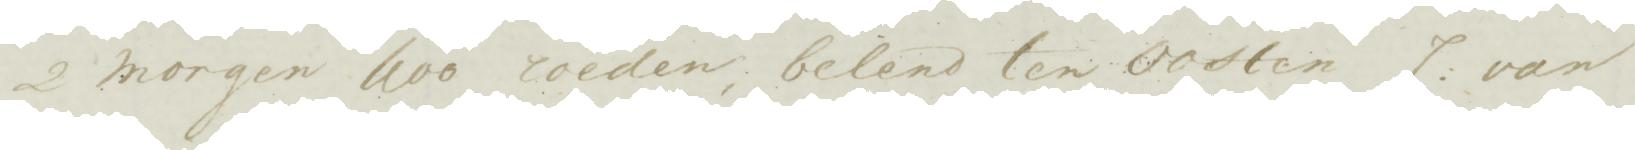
2 morgen 400 roeden, belend ten Oosten J: van
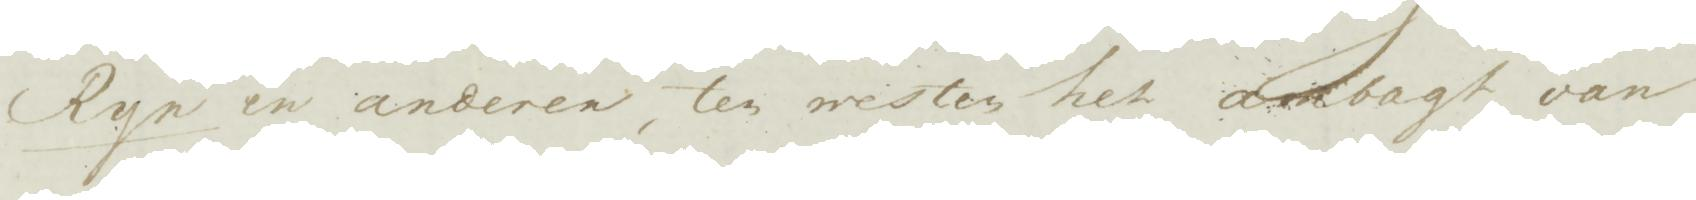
Ryn en anderen, ten westen het ambagt van
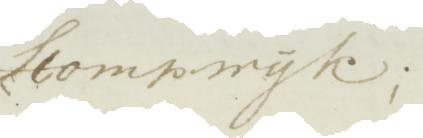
Hompwijk:
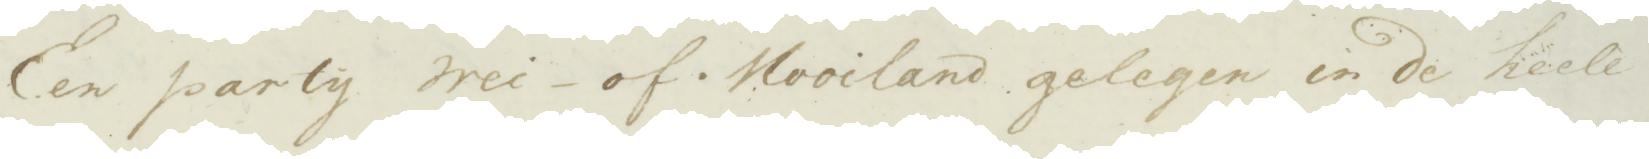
Een partij wei- of. Hooiland gelegen in de heele
